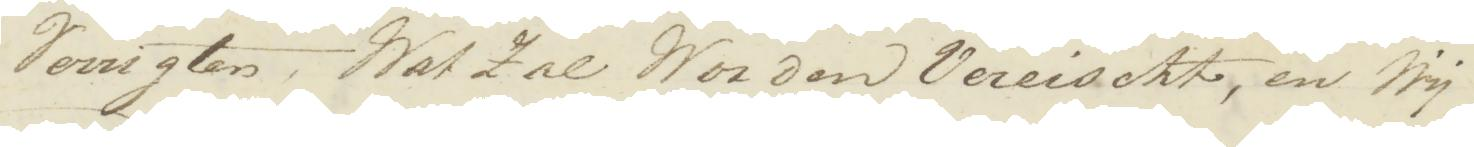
verrigten, wat zal worden vereischt, en wij
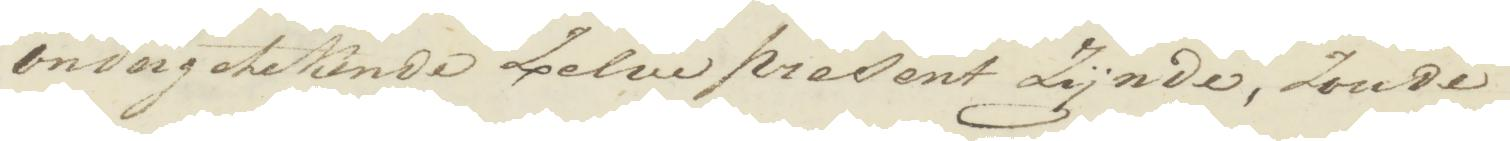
ondergetekende zelve present zijnde, zoude
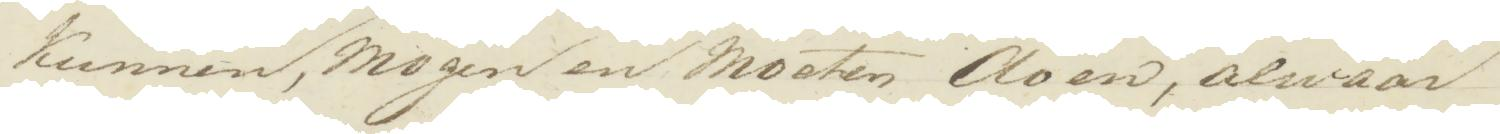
kunnen, mogen en moeten doen, alwaar
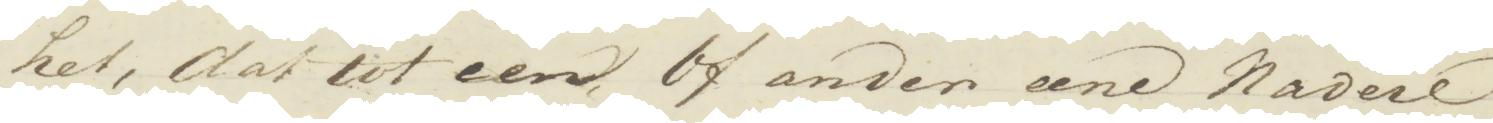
het, dat tot een of ander eene Nadere
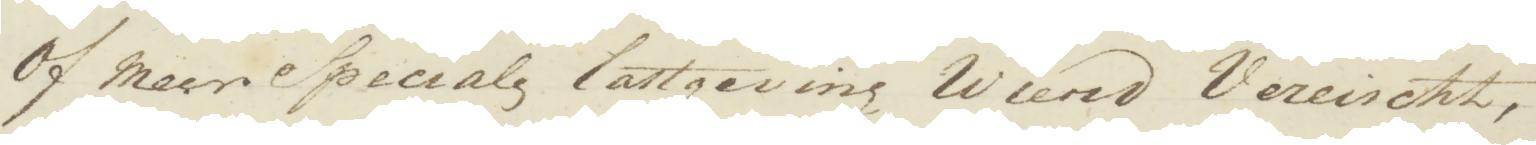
of meer speciale lastgeving wierd vereischt,
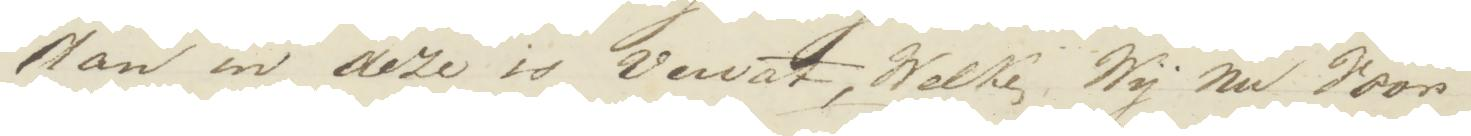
dan in deze is vervat, welke wij nu voor
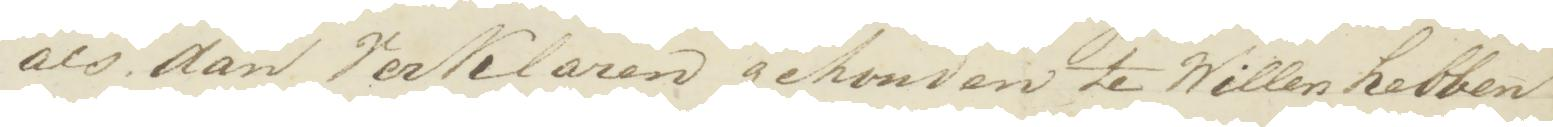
als dan verklaren gehouden te willen hebben
